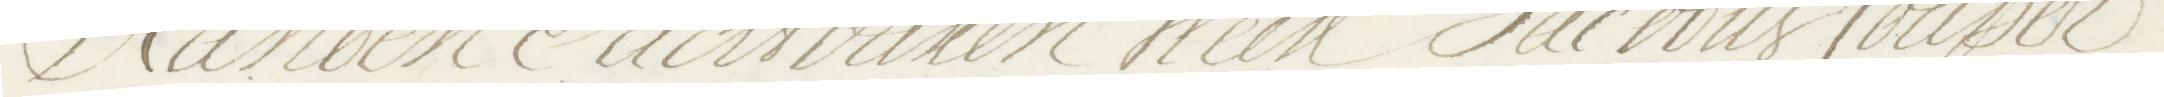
Aan den E achtbaren heer Jacobus Couper
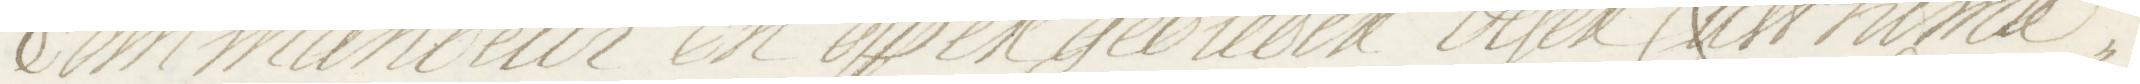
Commandeur en oppergebieder deser Cust suma„
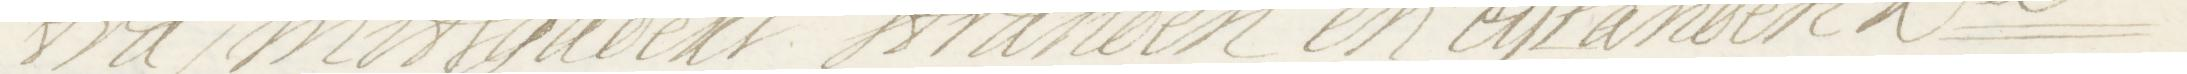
tra, mitsgaders stranden en Eijlanden &=a
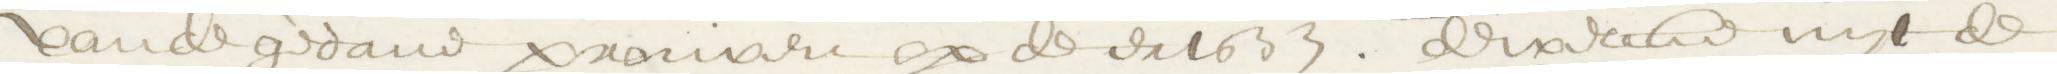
vande gedane prouven op de ertsz 3. dewelcke uijt de
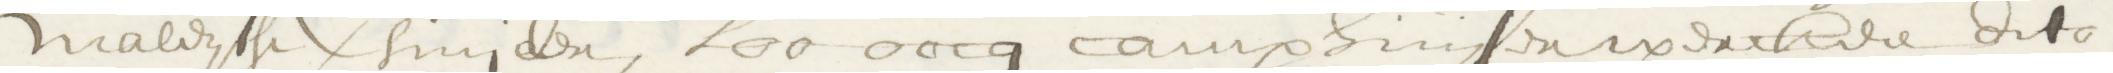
maleijtse, suijder, soo oocq camphuijser wercken dito
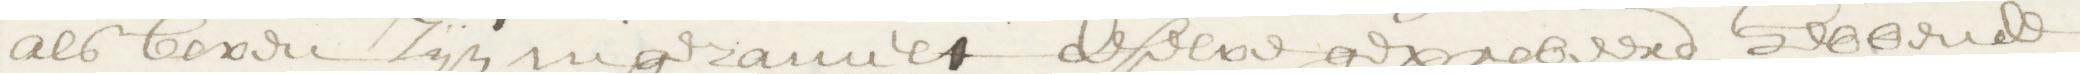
als boven zijn ingezamelt deselve geprobeerd hebbende
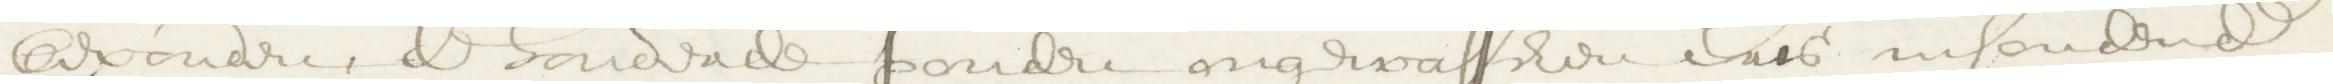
bevonden, de honderde ponden ongewasschen Erts inhoudende
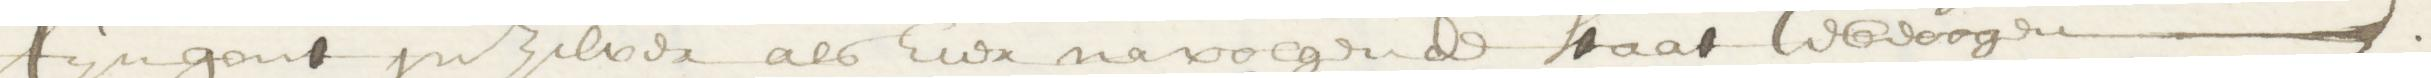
fyngout jnzilver als hier navolgende staat tebeoogen).
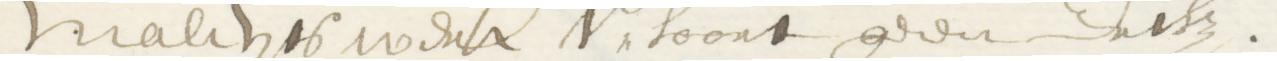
maleijts werk 1„e soort geen Ertsz.
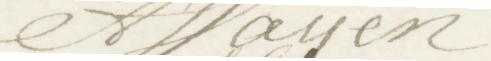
Assaijen
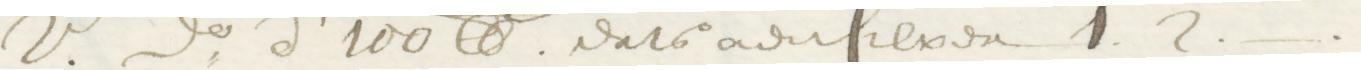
2.e d„o d' 100 lb. erts aensilver 1. 2. —.
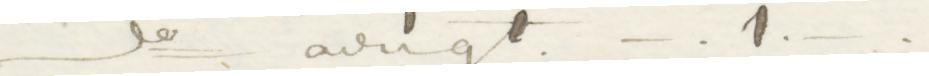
_=o aeng.t —. 1. —.
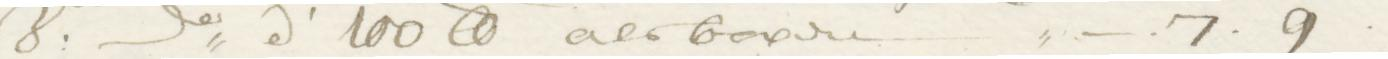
3.e d„o d' 100 lb alsboven „ —. 7. 9.
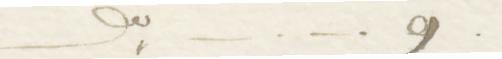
_„o —. —. 9.
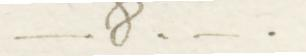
—. 8. —.
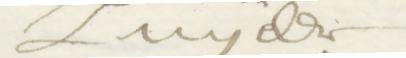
Zuijder
